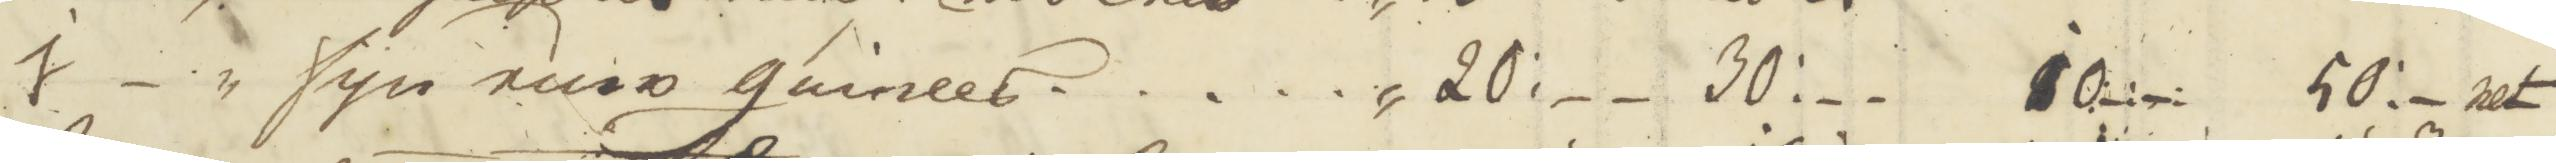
1 - „ sijn ruw guinees . . . . . „ 20:_ _ 30:_ _ 10:-: 50:_ nlt
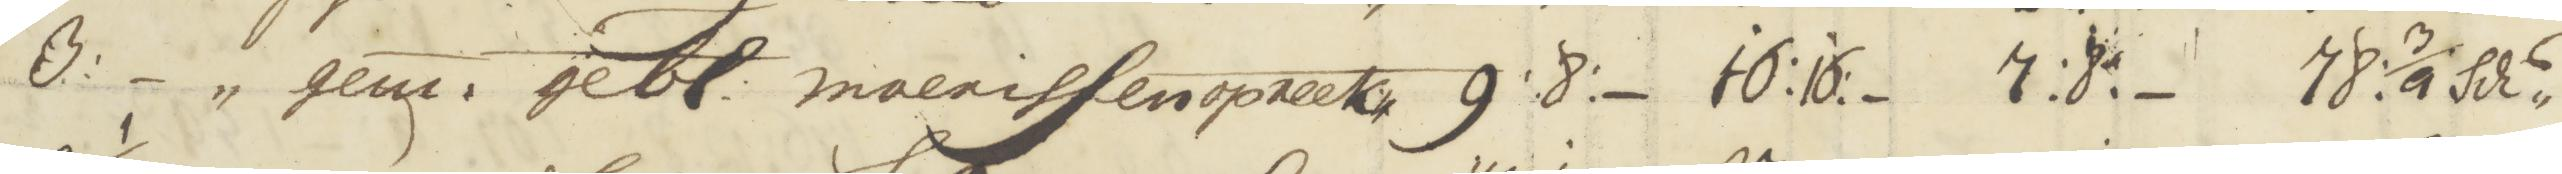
3: — „ gem: gebl: moerissen op reek„ 9:8:- 16:16:- 7:8:_ 78:¾ sch„s
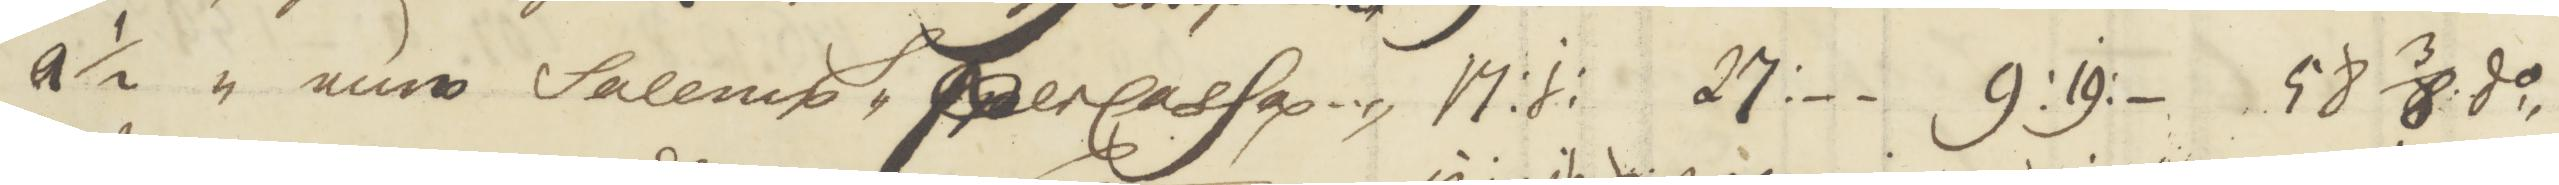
4½ „ ruw Salemp„s Per Cassa . . „ 17:8: 27:- - 9:9:- 58 3/8: d„o
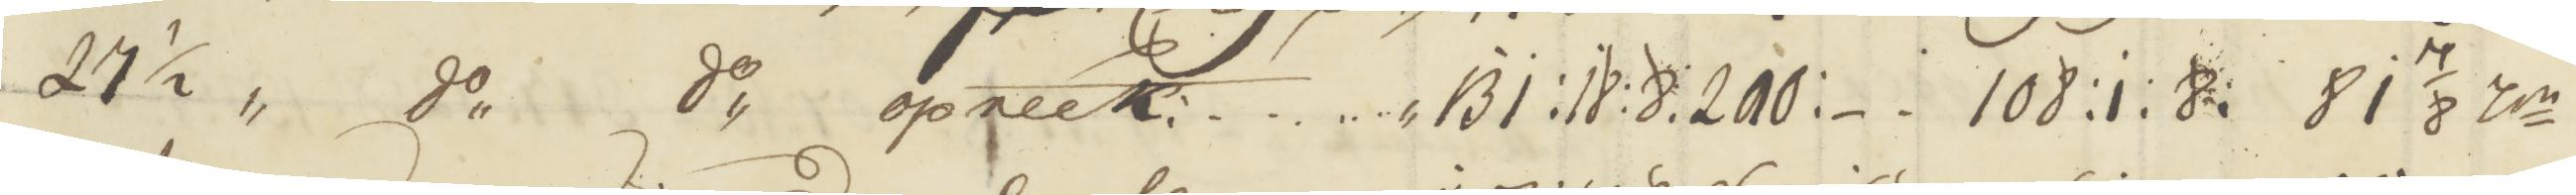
27½ „ d„o d„o op reek: . . . . . . . „ 131:18:8:240: - - 108:1:8: 81 7/8 r=m
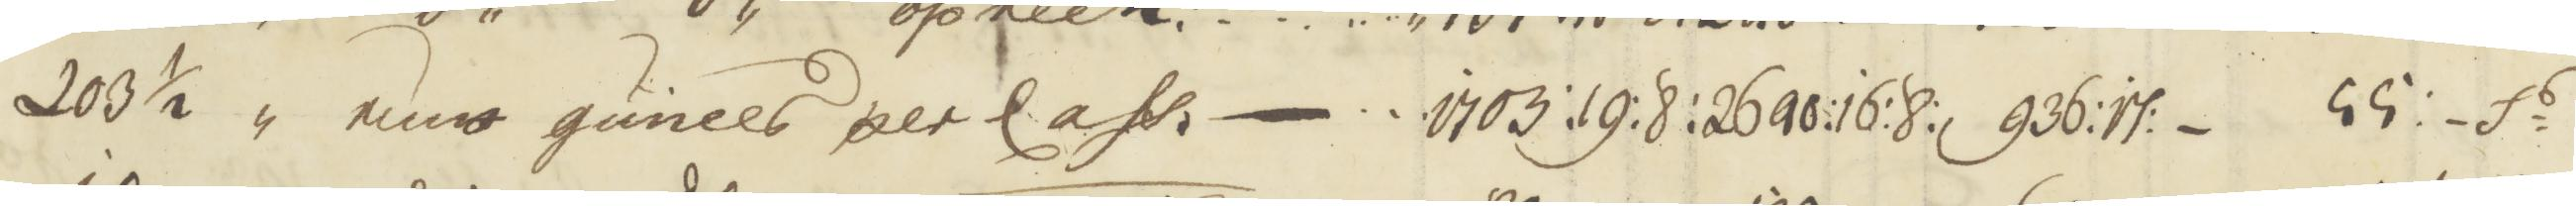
203½ „ ruw gunees per Cass: — ... 1703:19:8: 2640:16:8: 936:17: - 55:-s=s
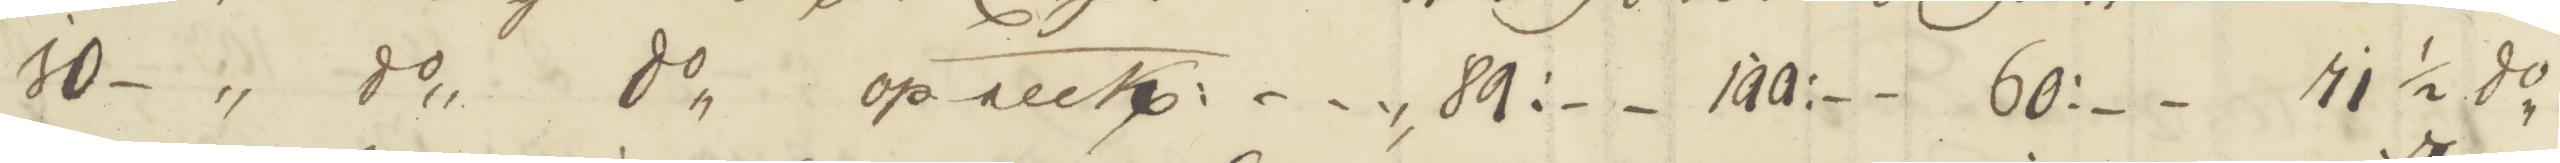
10– „ d„o d„o op reek: ... „ 84: - - 144: - - 60: - - 71 ½ d„o
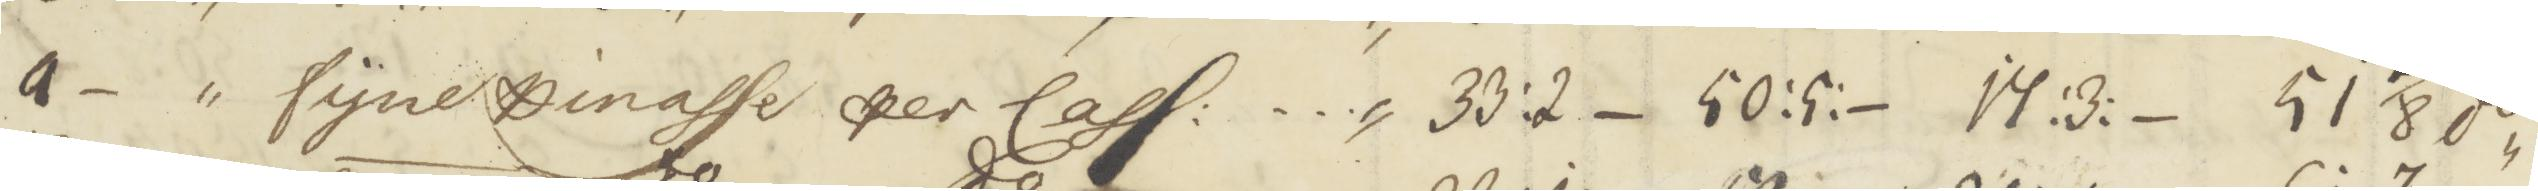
4 – „ sijne pinasse per Cass: ... „ 33:2. - 50:5: - 17:3: - 51 7/8 d„o
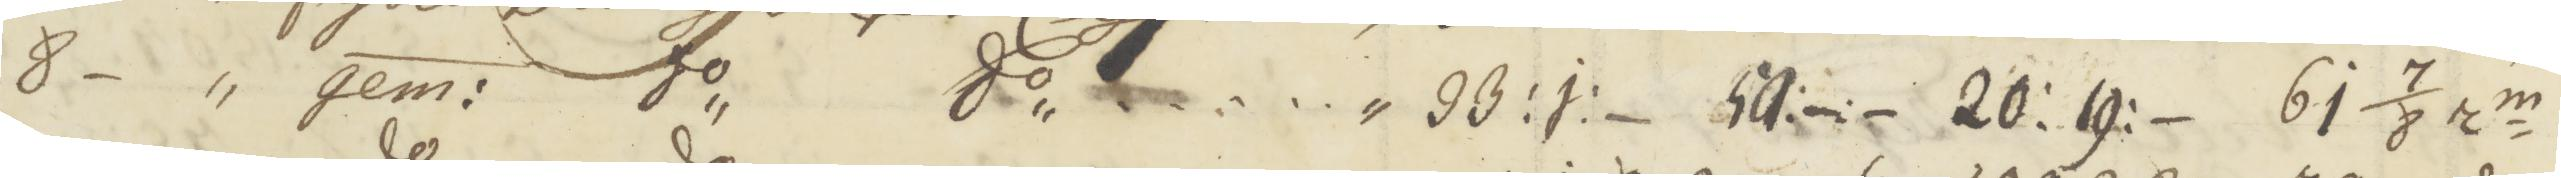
8- „ gem: d„o d„o . . . . . „ 33:1: - 54: - : - 20:19:- 61 7/8 r=m
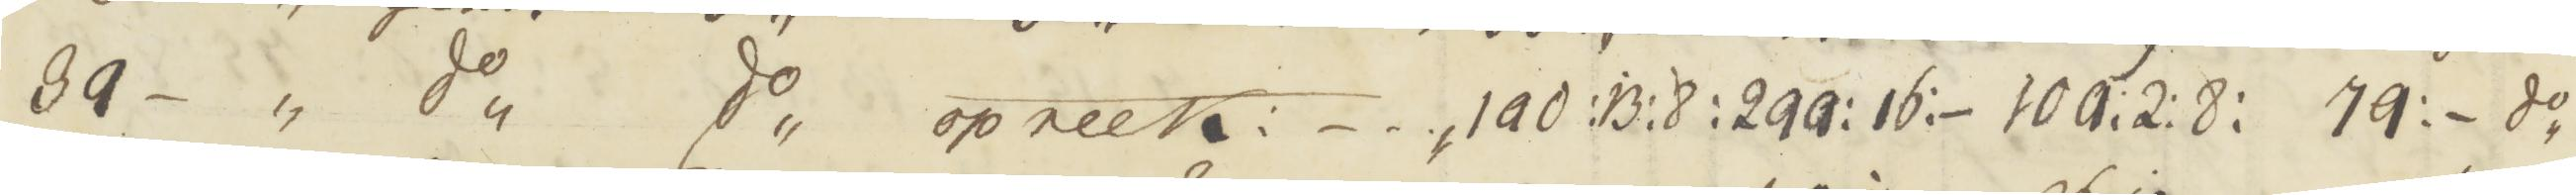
34- „ d„o d„o op reek: - . . . „ 140:13:8:299:16:- 104:2:8: 74:– d„o
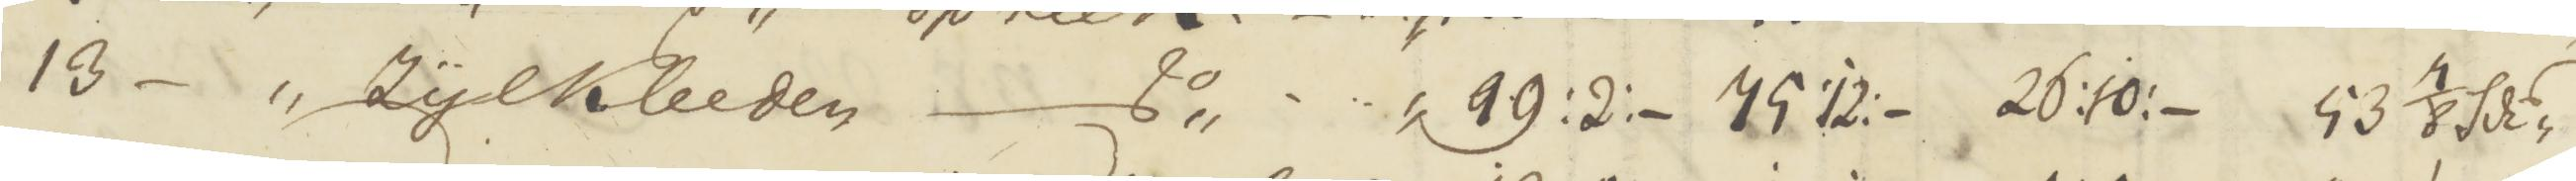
13 – „ zijlkleeden d„o ... „ 49:2:- 75:12:- 26:10:- 53 7/8 sch„s
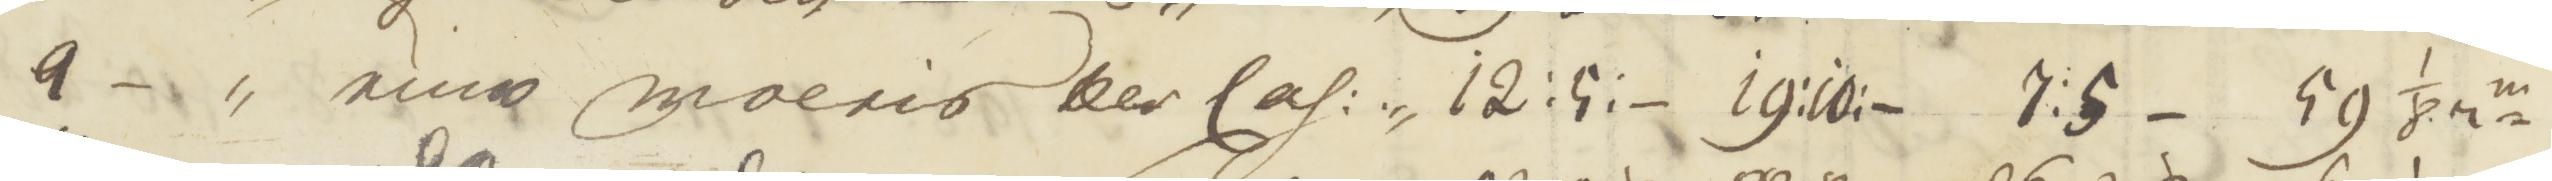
4 - „ ruw moeris per Cas: .„ 12:5:- 19:10:- 7:5 - 59 1/8 r=m
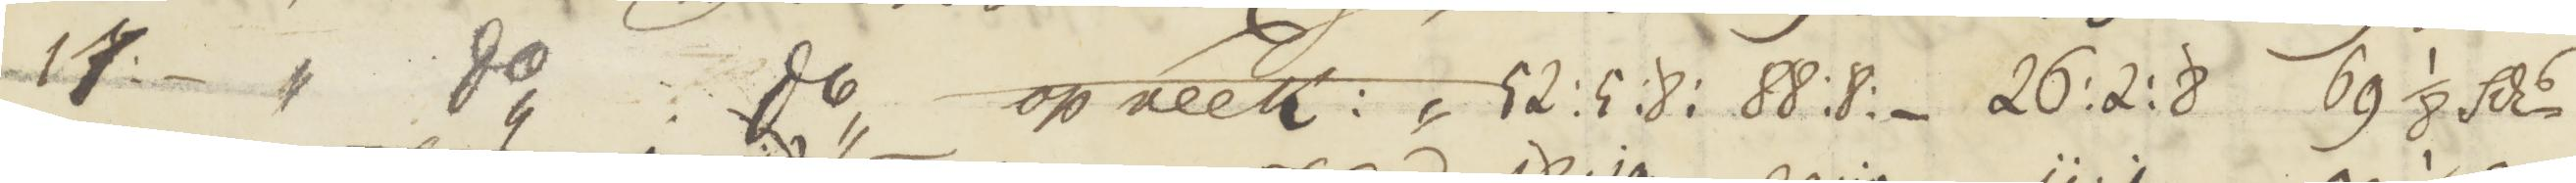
17: - „ d„o d„o op reek: „ 52:5:8: 88:8:- 26:2:8 69 1/8 sch=s
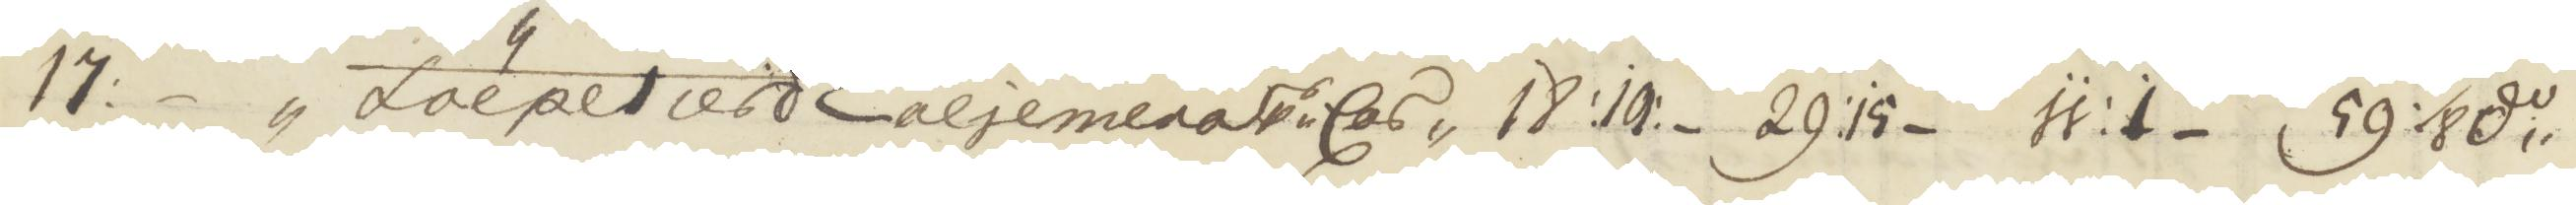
17: - „ toepetiesd' Caljemera p„s Cas„ 18:14:- 29:15- 11:1- 59: 188 d„o
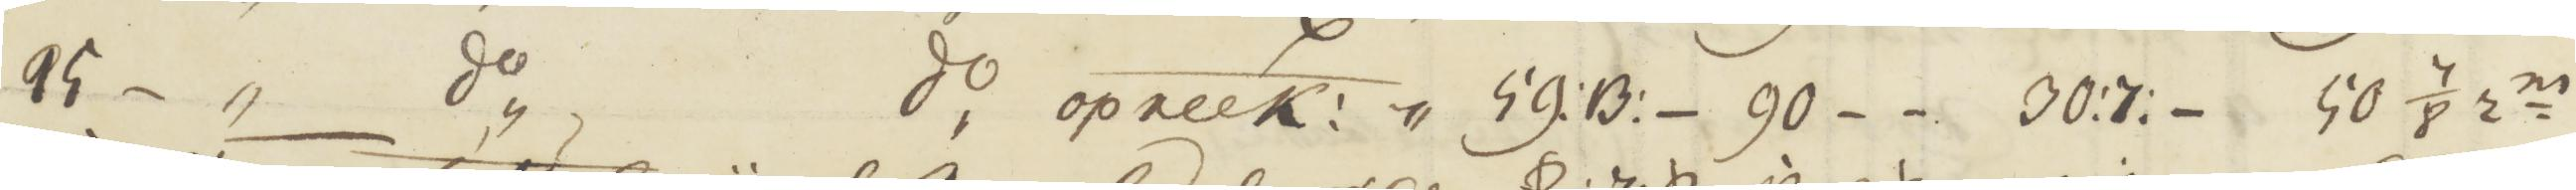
45- „ d„o d„o op reek: „ 59:13:- 90- - 30:7: - 50: 1/8 r=m
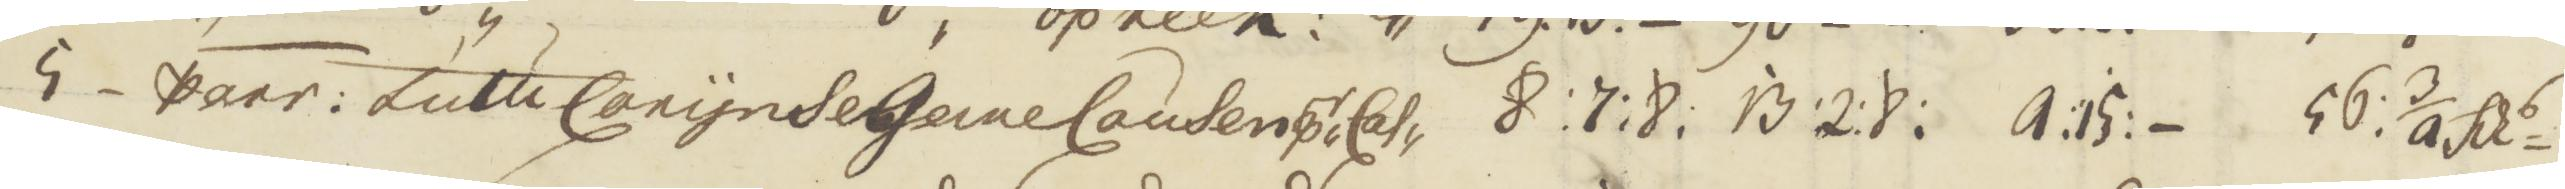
5 - parr: tutu Carijnse Geme Causen p„r Cas„ 8:7:8: 13:2:8: 4:15:- 56:¾ sch=s
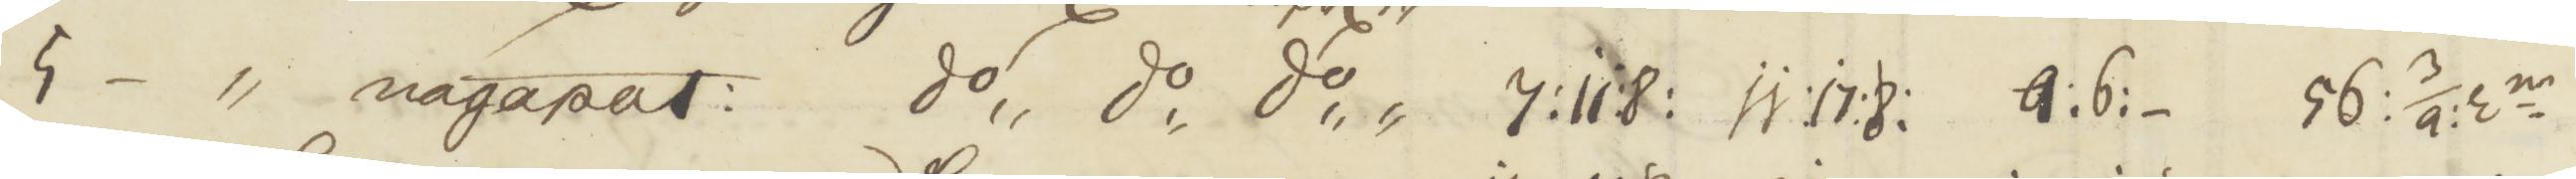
5 – „ nagapat: d„o d„o d„o „ 7:11:8: 11:17:8: 4:6: - 56:¾: r=m
